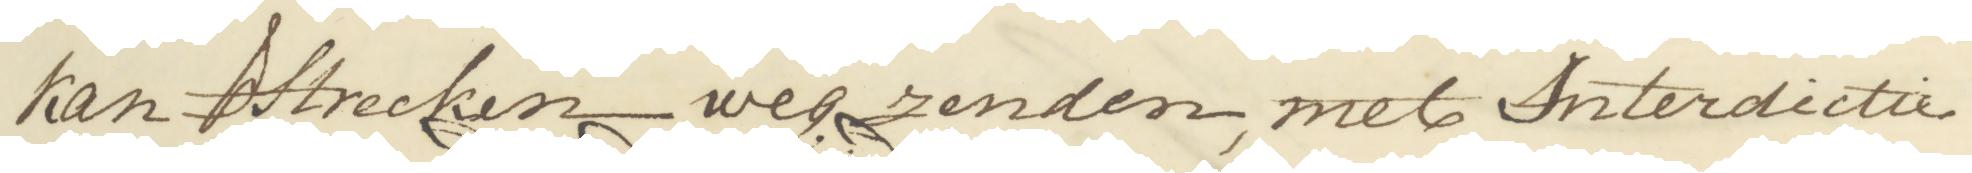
kan verstrecken weg zenden, met Interdictie
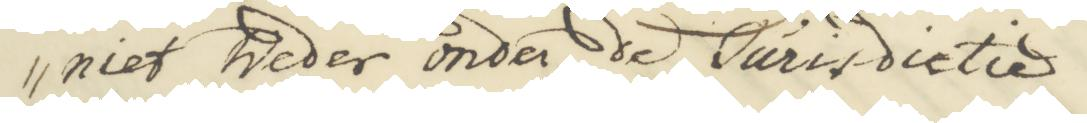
„niet weder onder de Iurisdictie
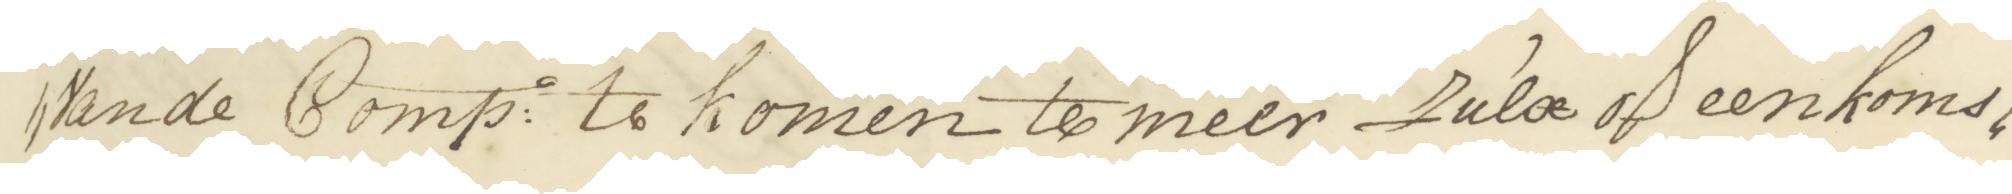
„vande Comp: te komen te meer zulx over eenkoms„
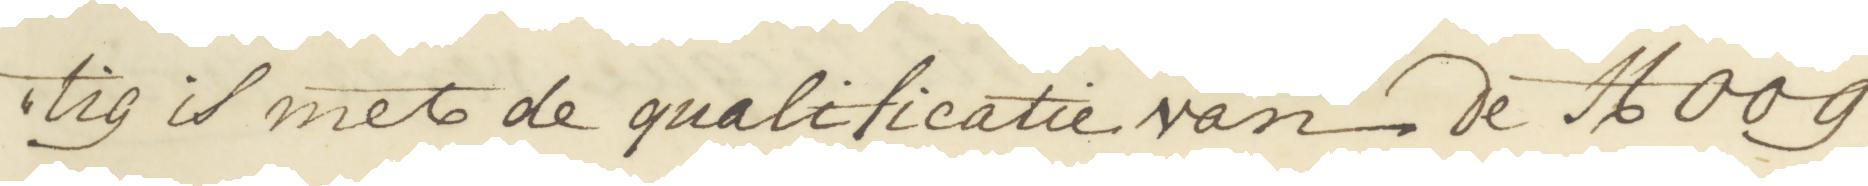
„tig is met de qualificatie van de Hoog
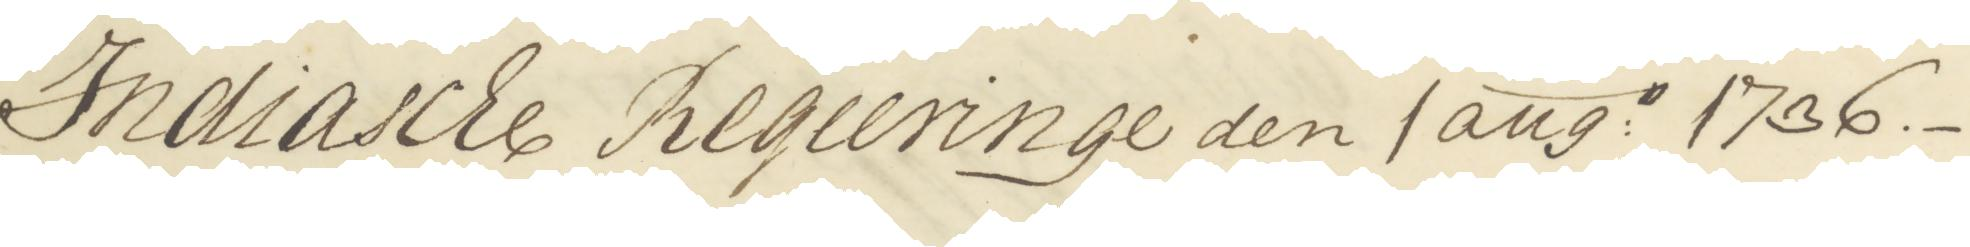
Indiasche Regeeringe den 1 aug:s 1736.—
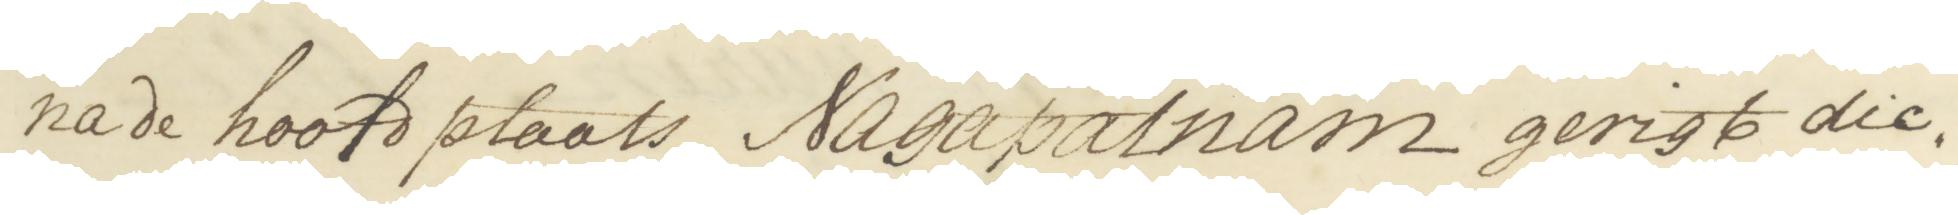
na de hoofd plaats Nagapatnam gerigt dic„
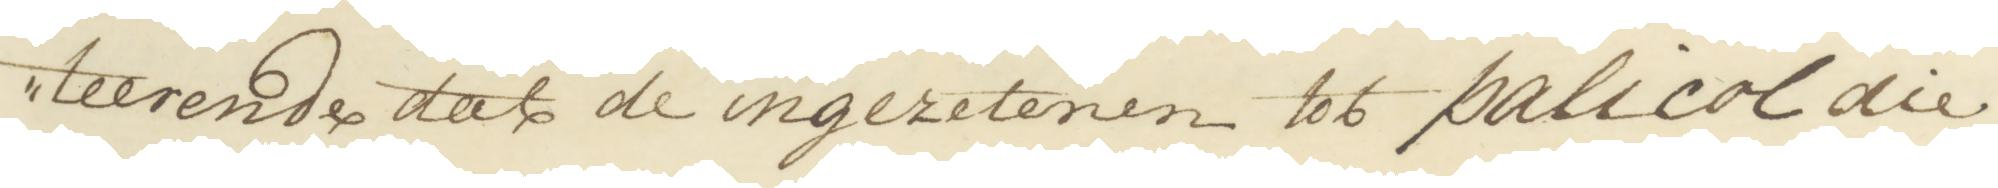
„teerende dat de ingezetenen tot palicol die
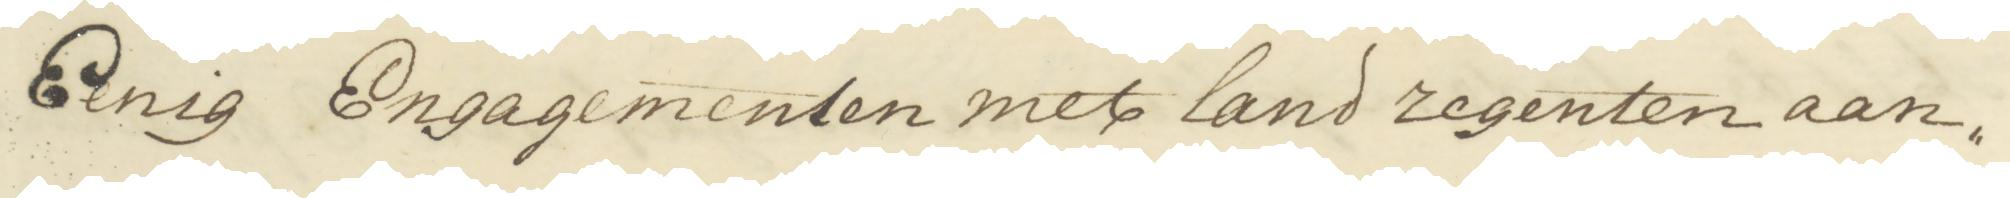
Eenig Engagementen met land regenten aan„
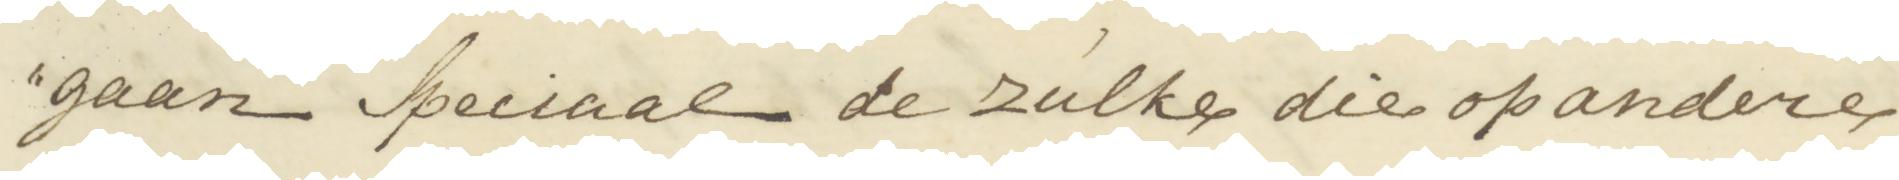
„gaan speciaal de zulke die op andere
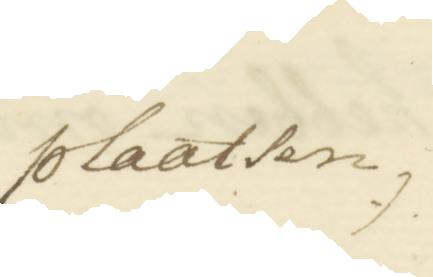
plaatsen,
